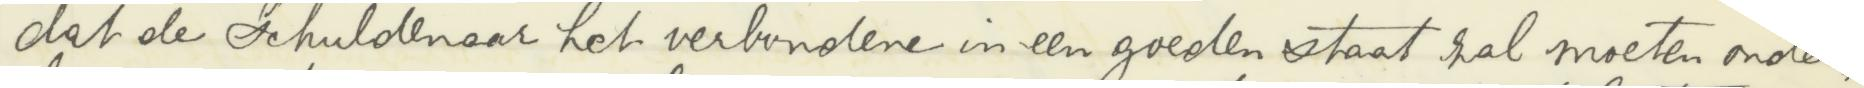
dat de Schuldenaar het verbondene in een goeden staat zal moeten onder„
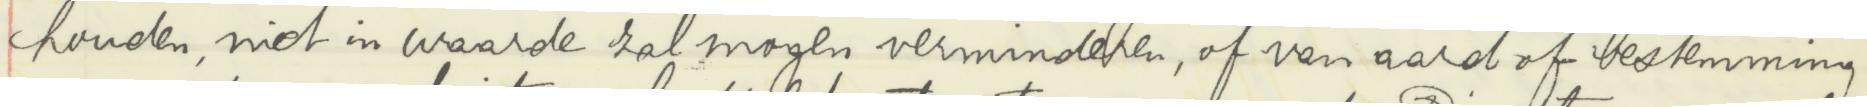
houden, niet in waarde zal mogen verminderen, of van aard of bestemming
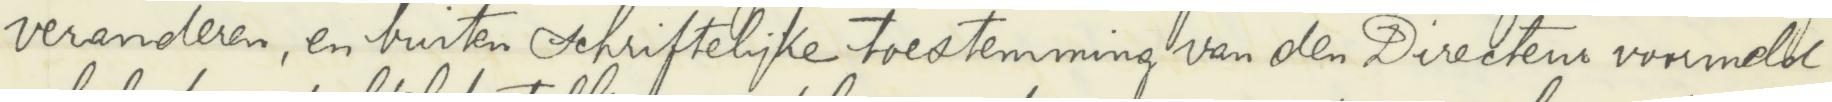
veranderen, en buiten schriftelijke toestemming van den Directeur voormeld
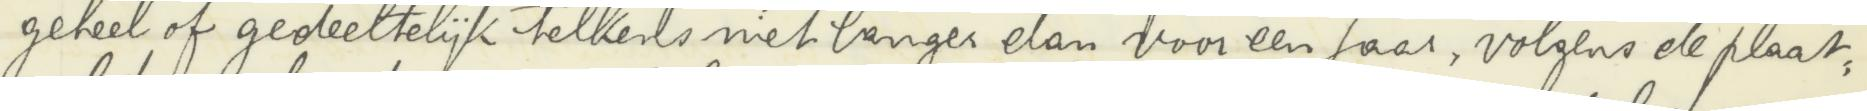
geheel of gedeeltelijk telkens niet langer dan voor een Jaar, volgens de plaat„
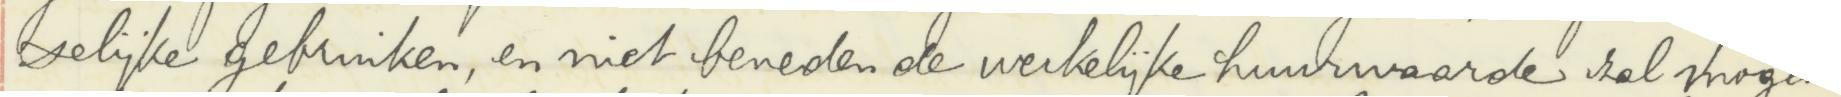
selijke gebruiken, en niet beneden de werkelijke huurwaarde zal mogen
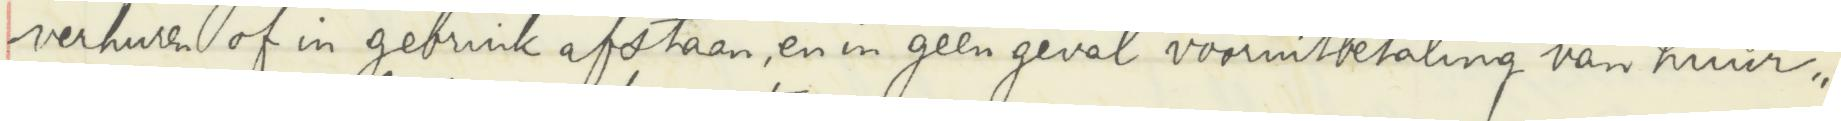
verhuren of in gebruik afstaan, en in geen geval vooruitbetaling van huur„
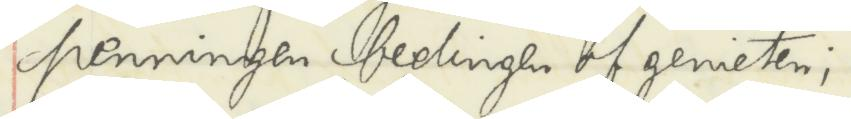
penningen bedingen of genieten;
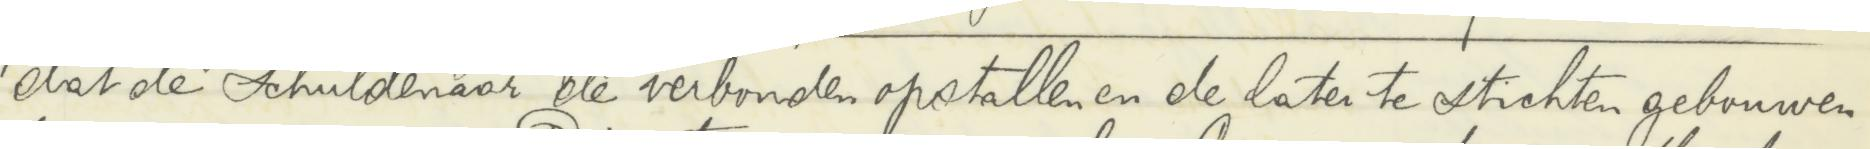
dat de schuldenaar de verbonden opstallen en de later te stichten gebouwen
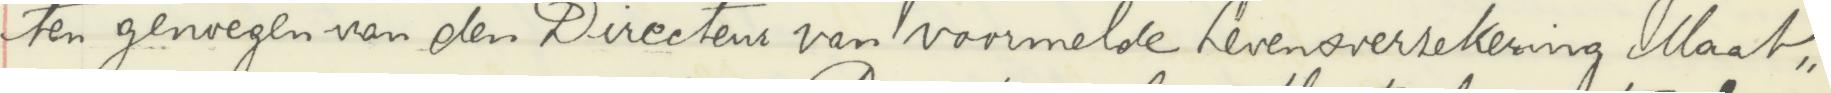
ten genoegen van den Directeur van voormelde Levensverzekering Maat
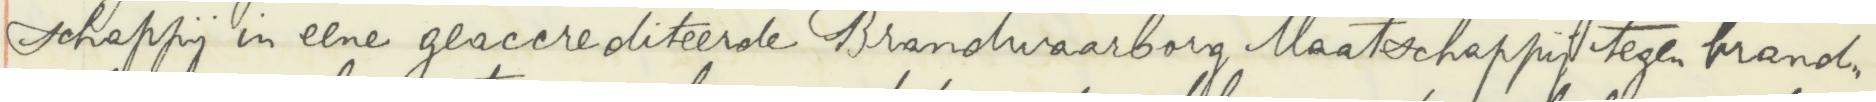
schappij in eene geaccrediteerde Brandwaarborg Maatschappij tegen brand„
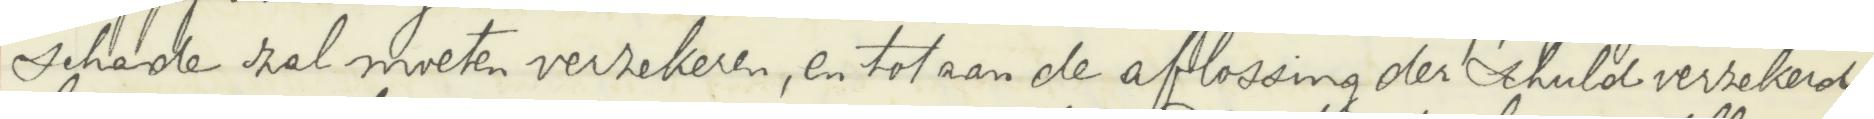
schade zal moeten verzekeren, en tot aan de aflossing der schuld verzekerd
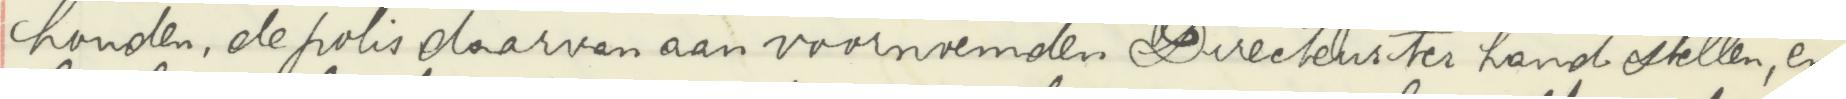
houden, de polis daarvan aan voornoemden Directeur ter hand stellen, en
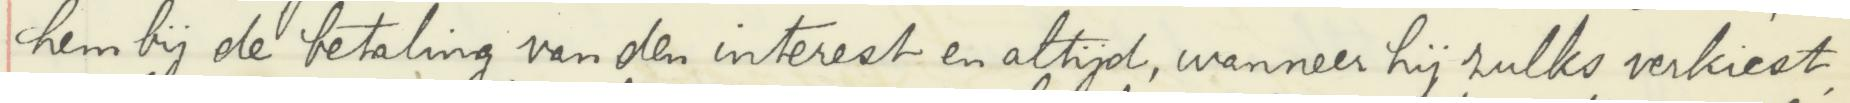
hem bij de betaling van den interest en altijd, wanneer hij zulks verkiest
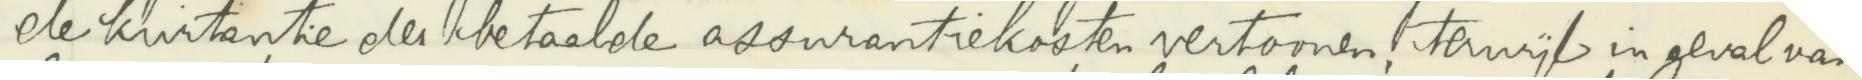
de kwitantie der betaalde assurantiekosten vertoonen; terwijl in geval van
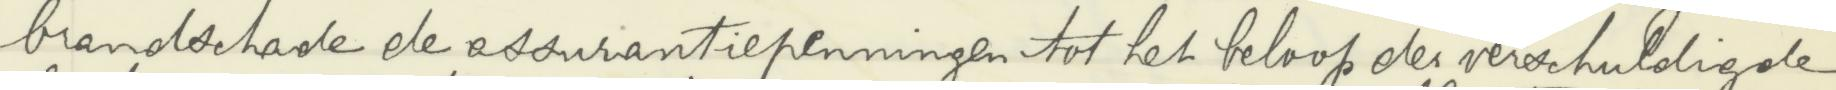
brandschade de assurantiepenningen tot het beloop der verschuldigde
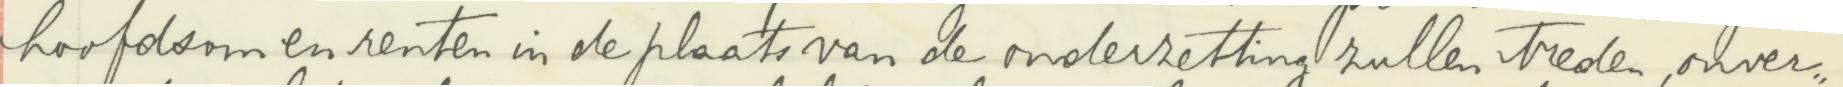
hoofdsom en renten in de plaats van de onderzetting zullen treden, onver„
